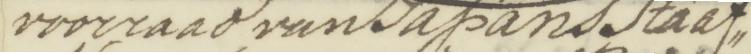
voorraad van Japans Staaf„
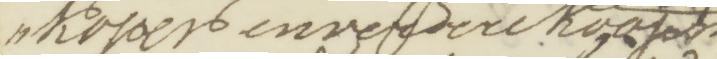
„Koper en verdere Kooper:
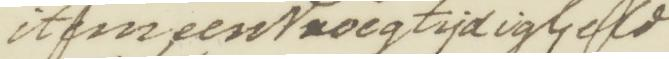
item een Vroegtijdig Geld
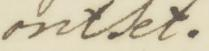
ontset.
